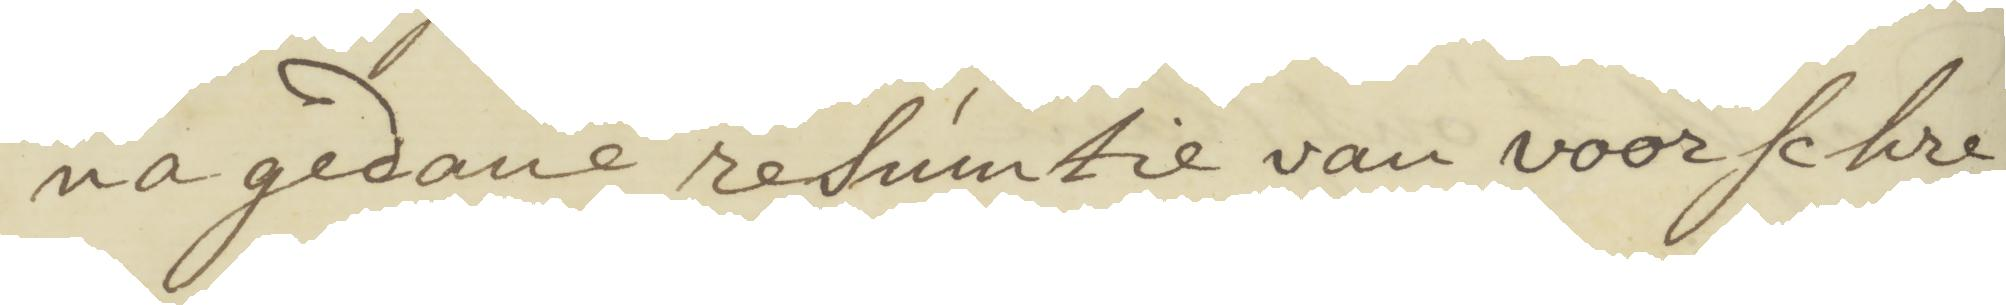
na gedane resumtie van voorschre
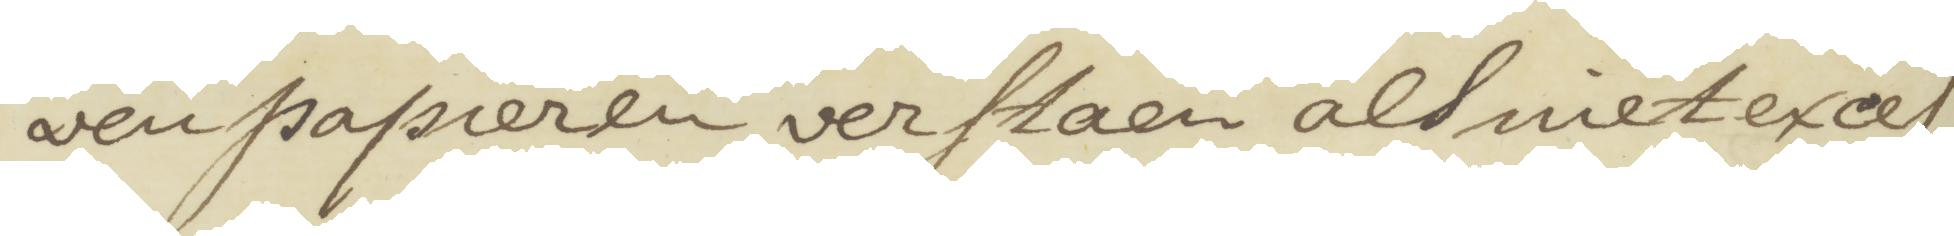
ven papieren verstaen als niet exces
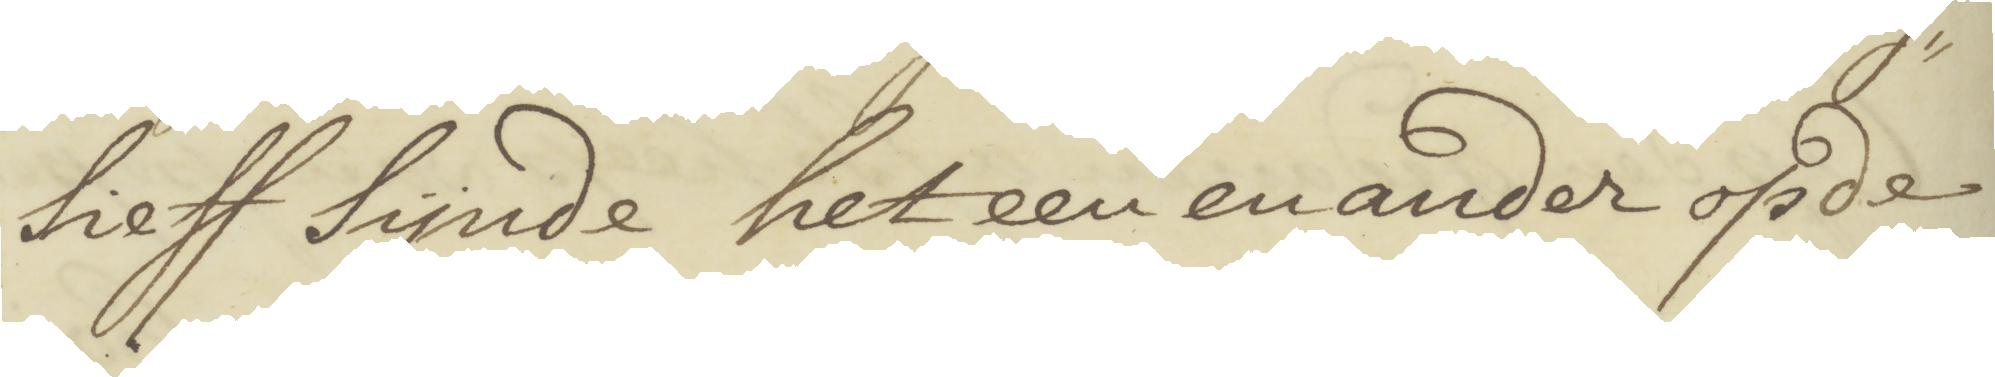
sieff sijnde het een en ander op de
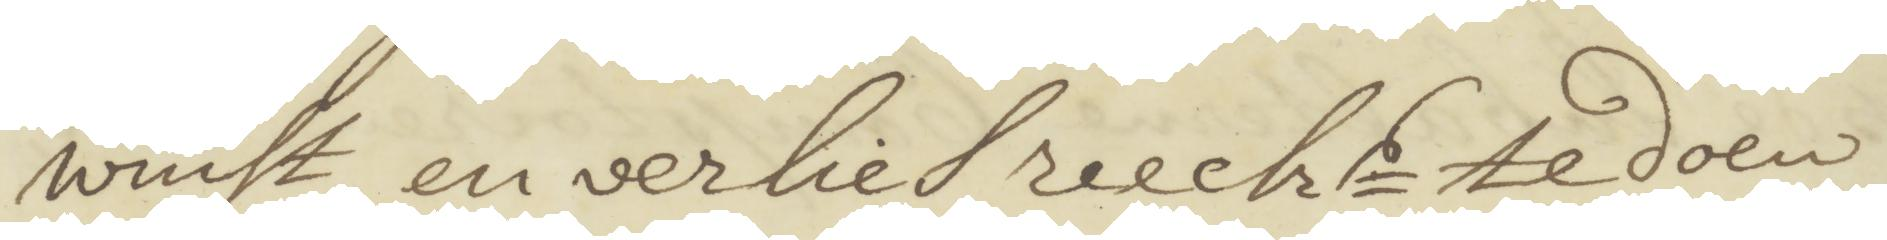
winst en verlies reeck=s te doen
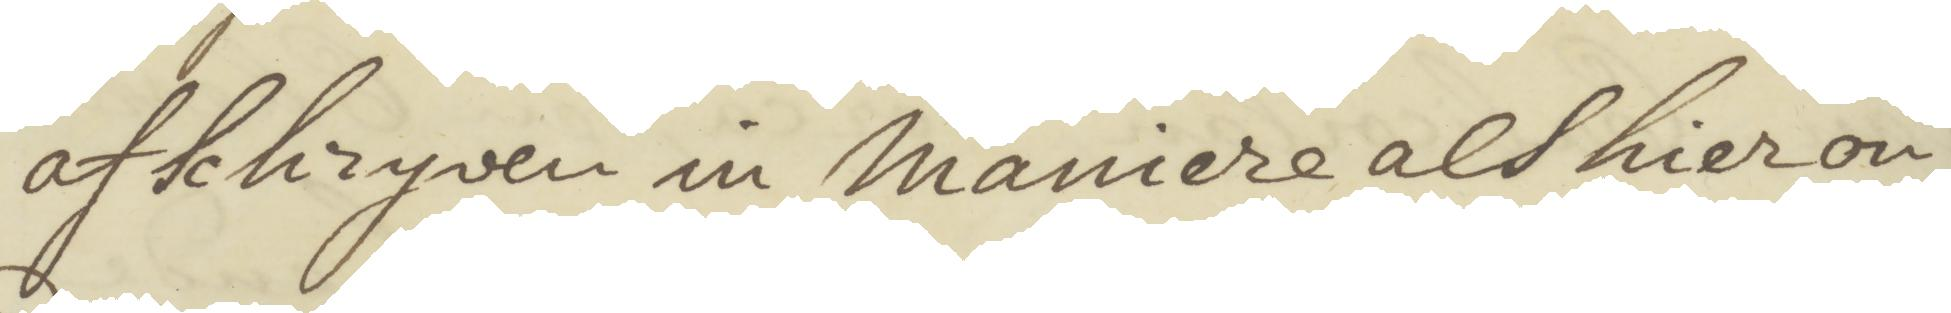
afschryven in maniere als hier on
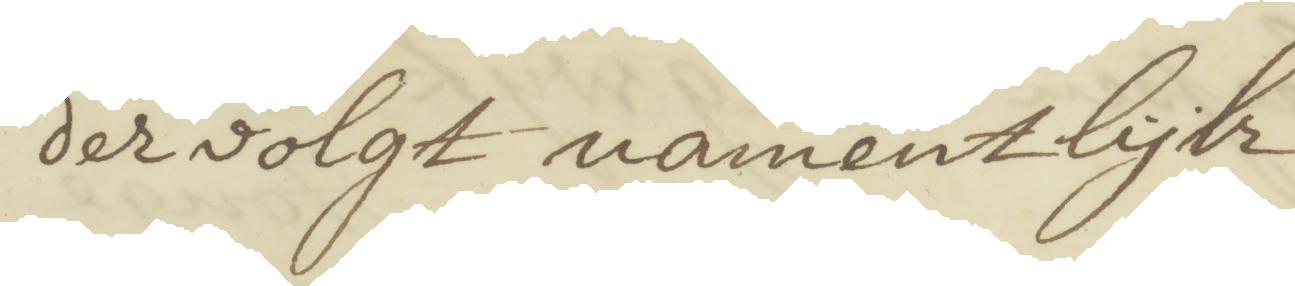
der volgt namentlijk
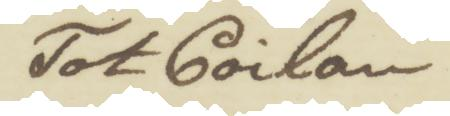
Tot Coilan
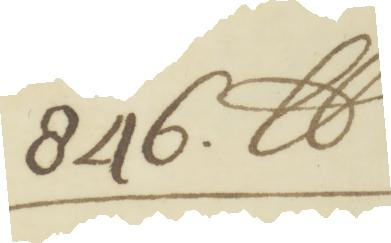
846. lb
